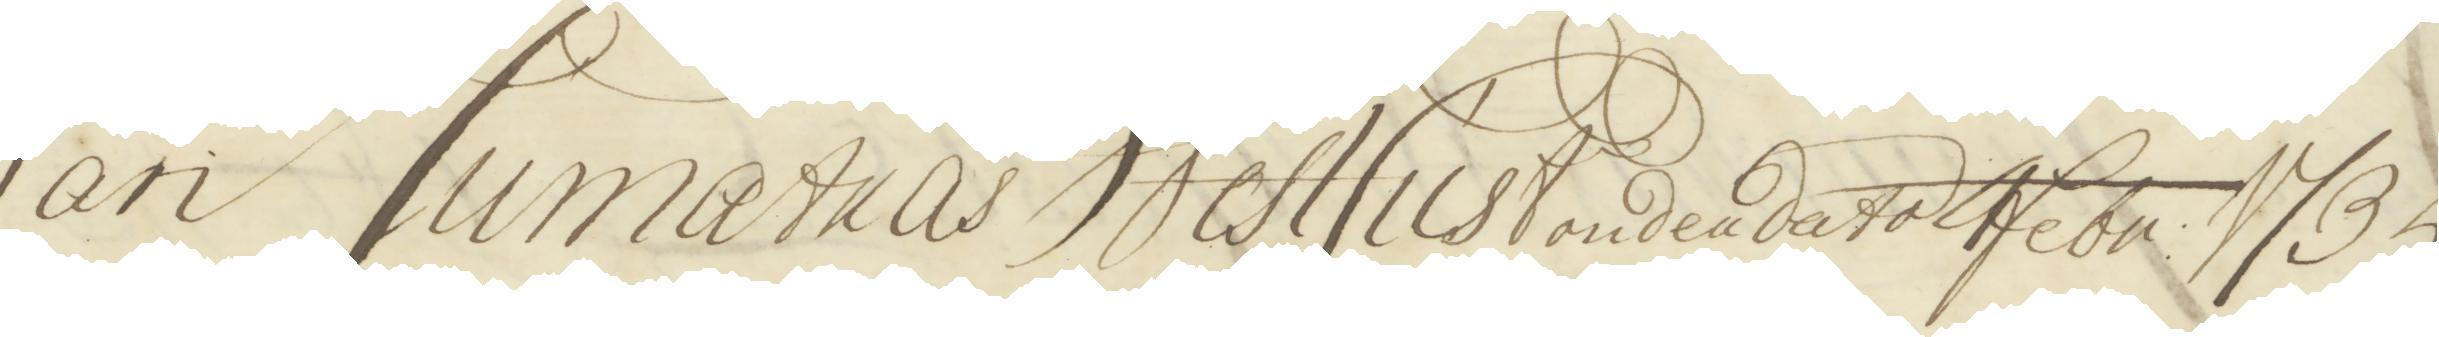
Van Sumatras WestCust onder dato 4 febr: 1735
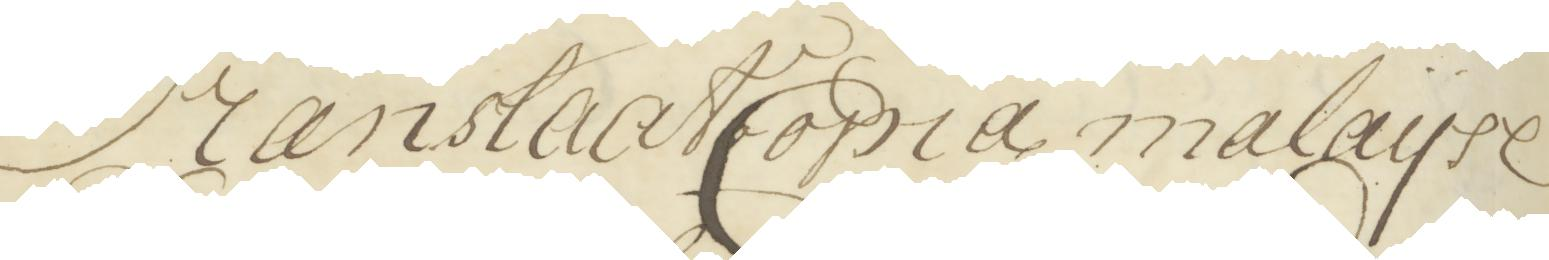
Translaat Copia malaijse
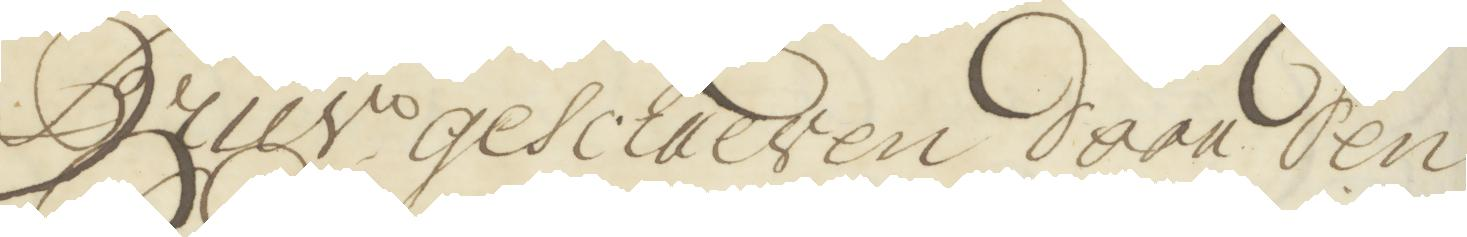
Briev, geschreven door den
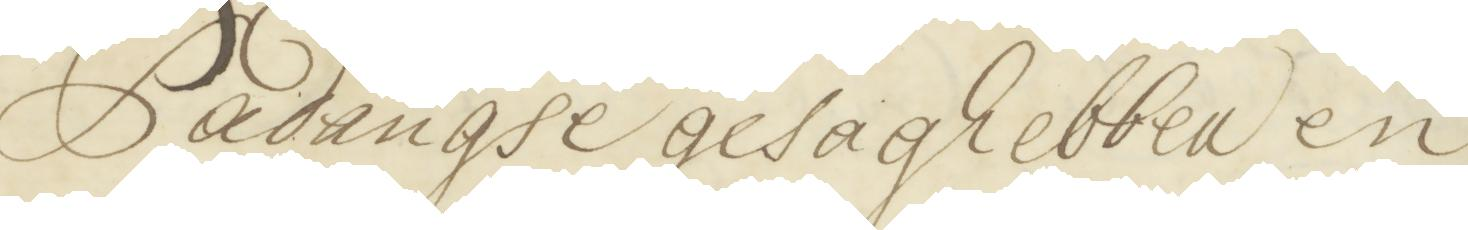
Padangse gesaghebber en
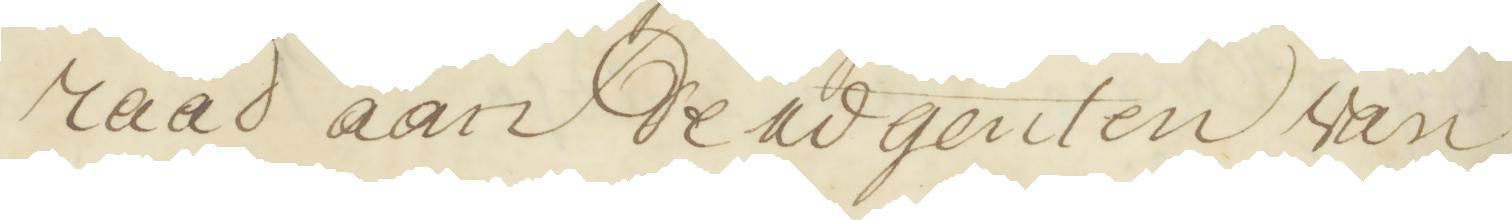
raad aan de regenten van
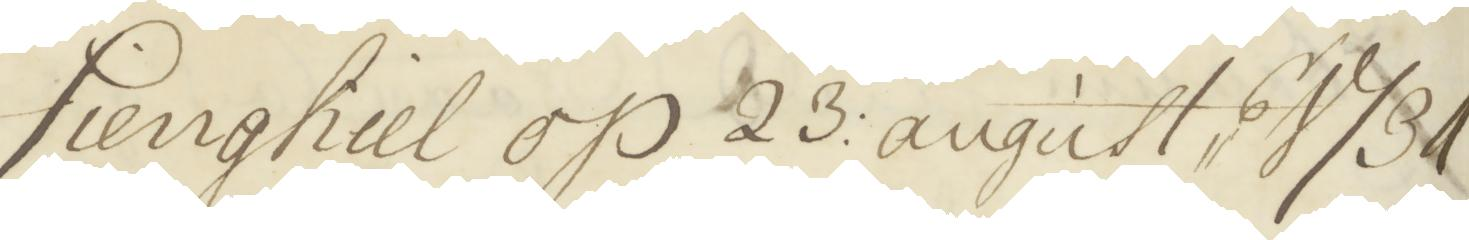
Siengkiel op 23:' august„s 1734
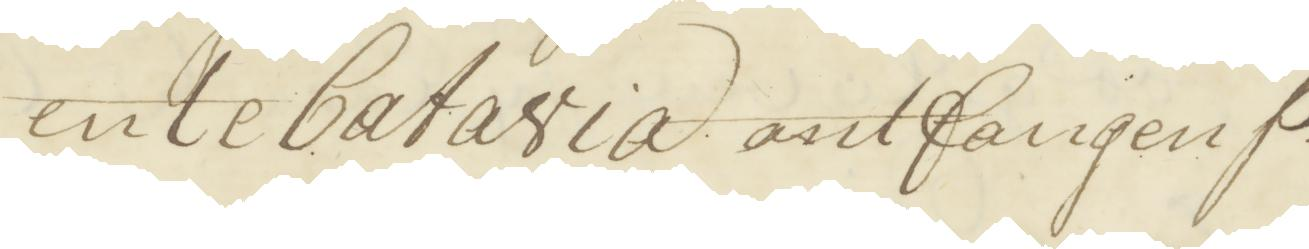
en te batavia ontfangen P=mo
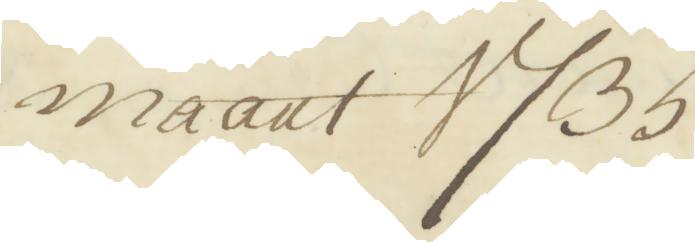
maart 1735
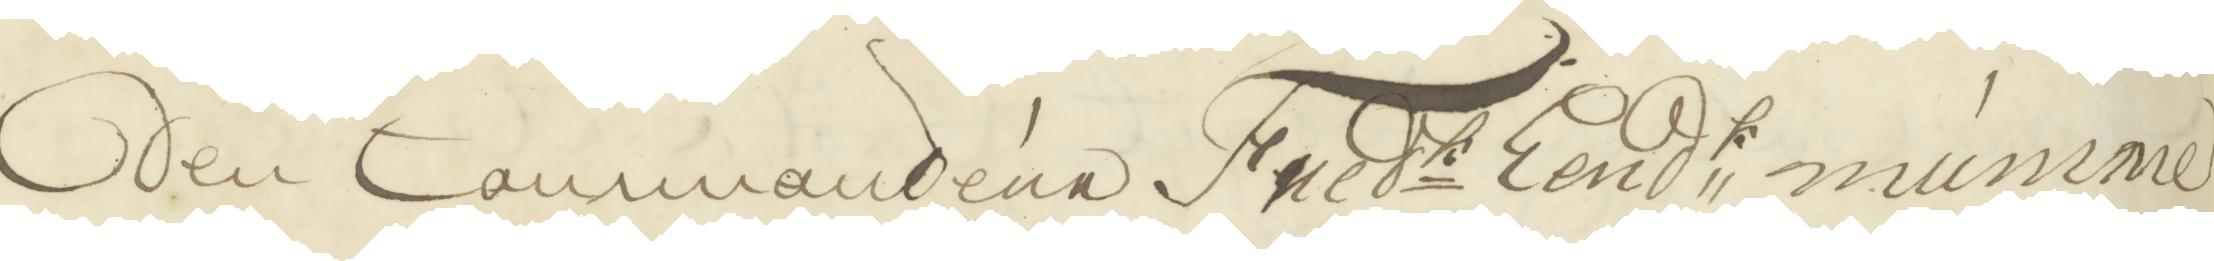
den Commandeur Fred=k Hend„k mumme
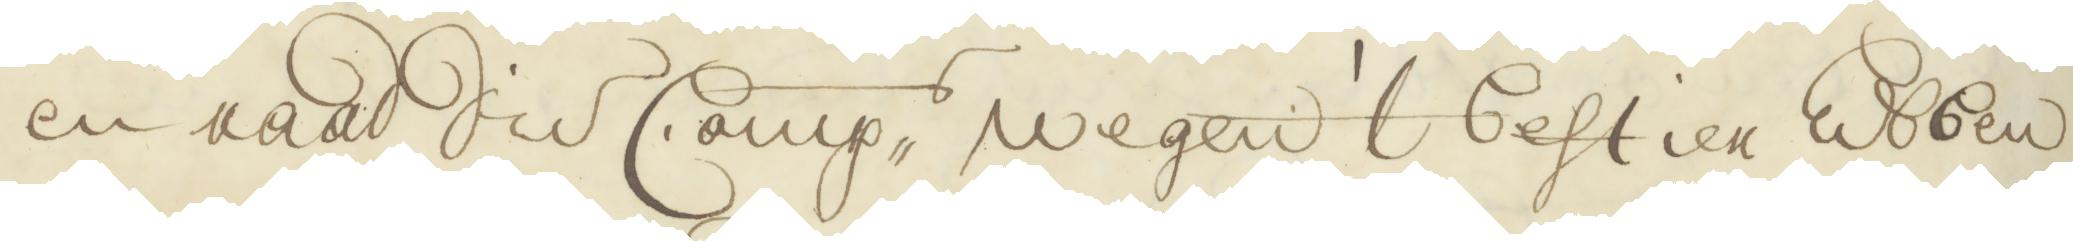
en raad die Comp„s wegen ’t bestier hebben
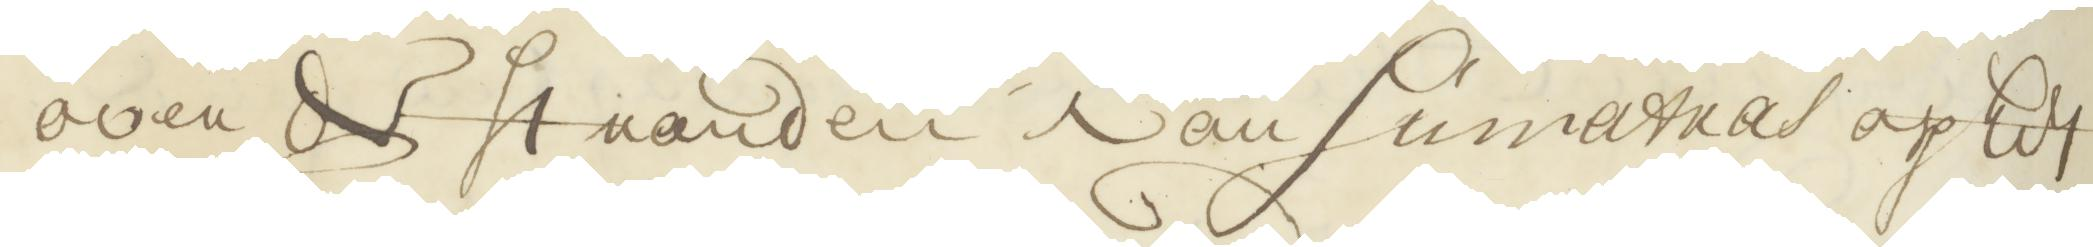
over de stranden van Sumatras op het
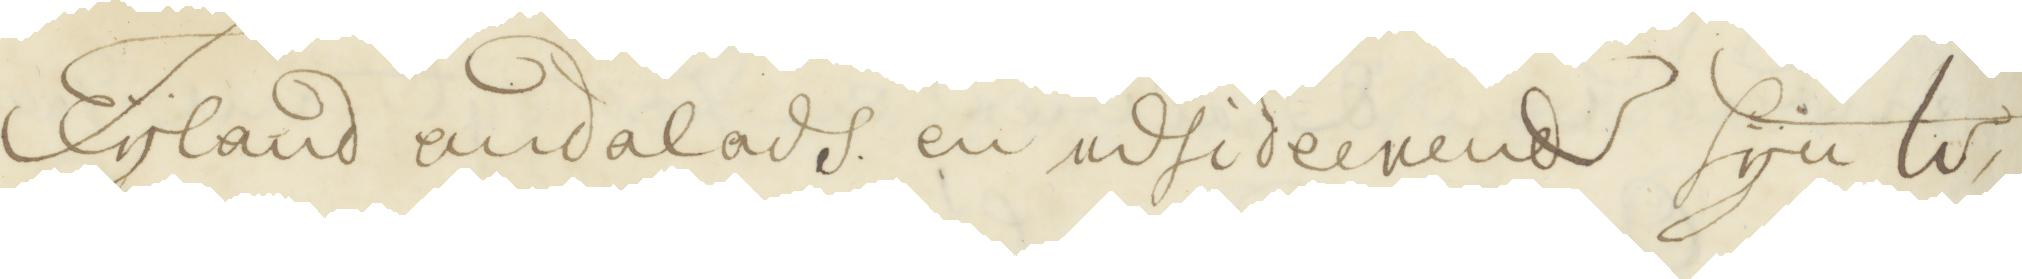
Eijland andalaes en resideerende sijn te
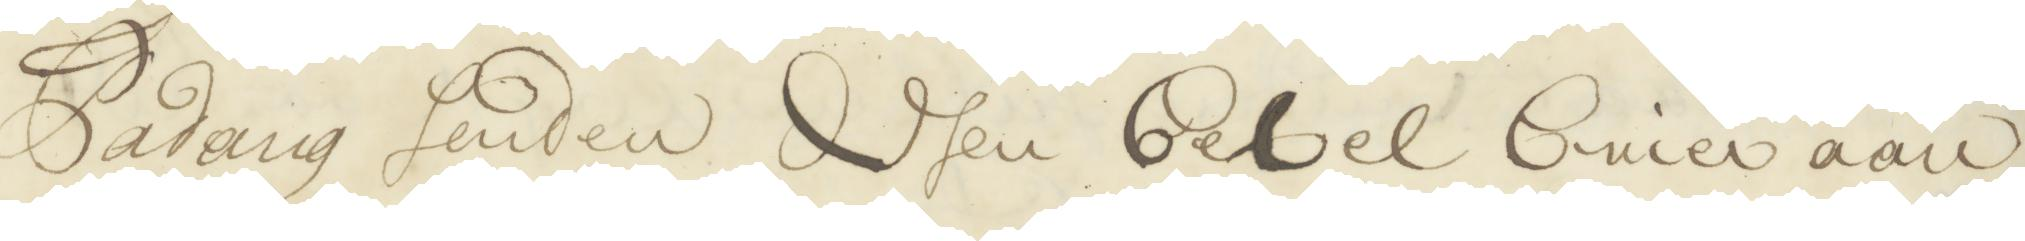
Padang sonden desen Betel briev aan
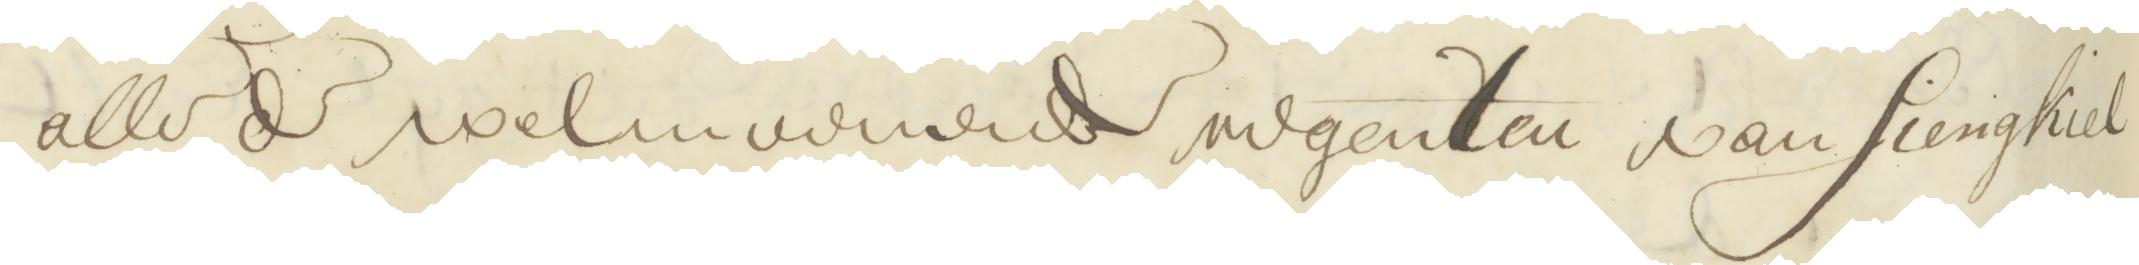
alle de welmeenende regenten van Siengkiel
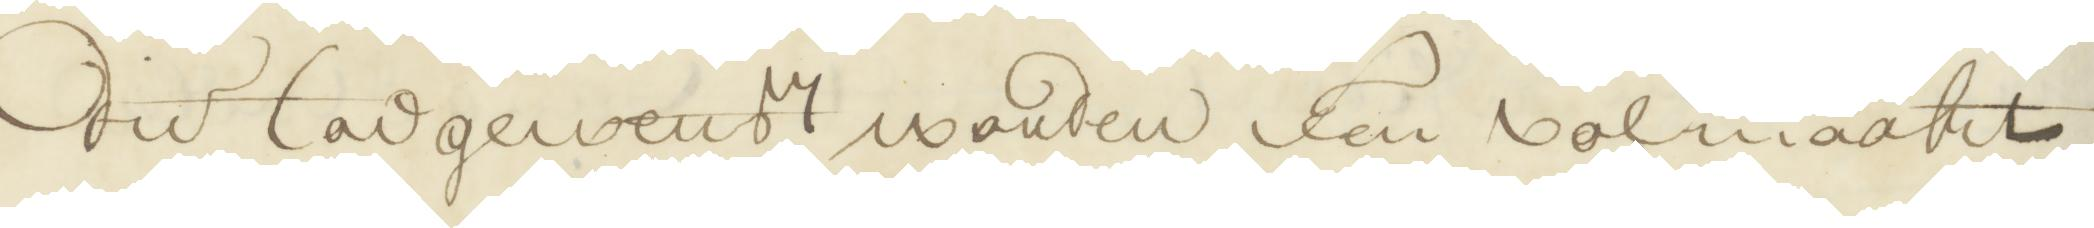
die toegewenst worden een volmaakt
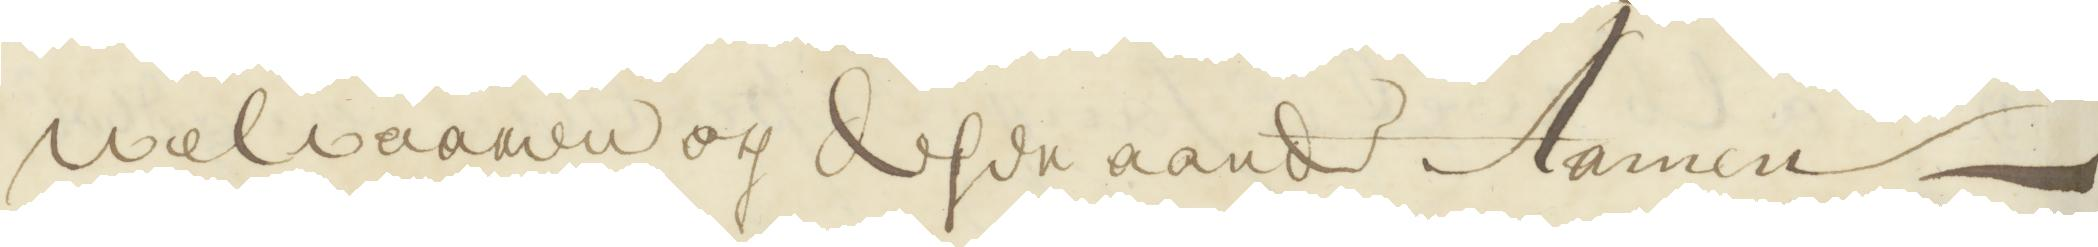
welvaaren op deser aarde Aamen—
